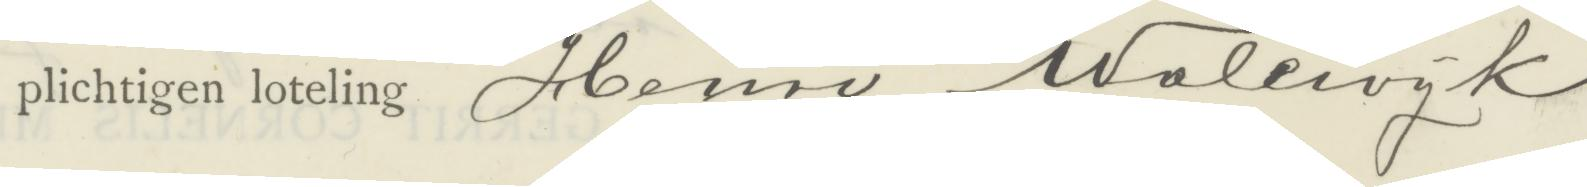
Henri Walewijk
